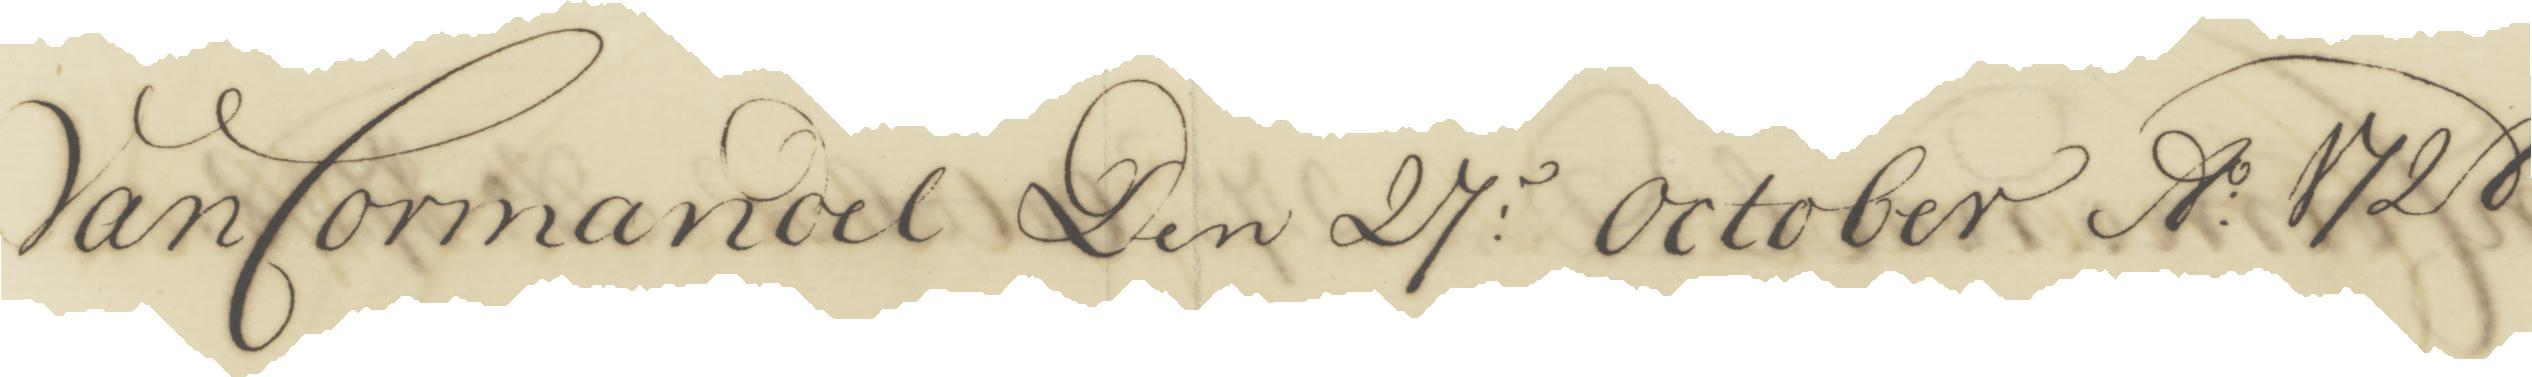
Van Cormandel Den 27:' October A:o 1728
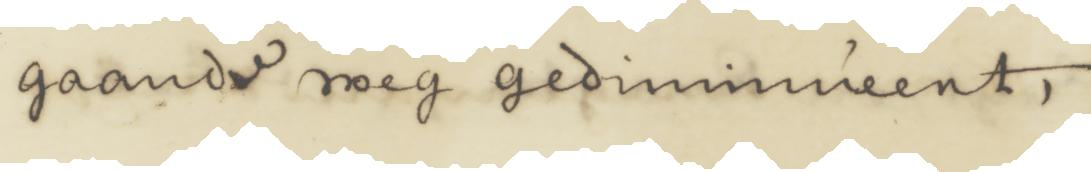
gaande weg gediminueert,
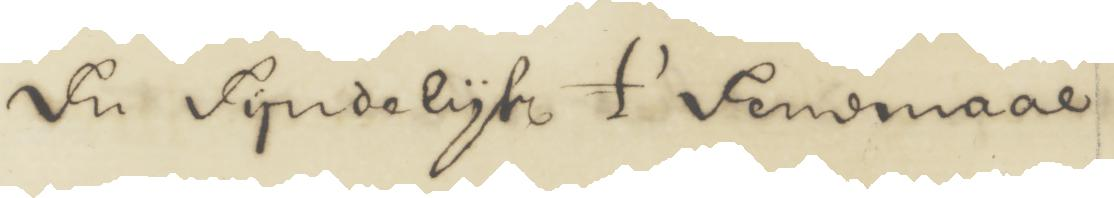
En Eijndelijk t' Eenemaal
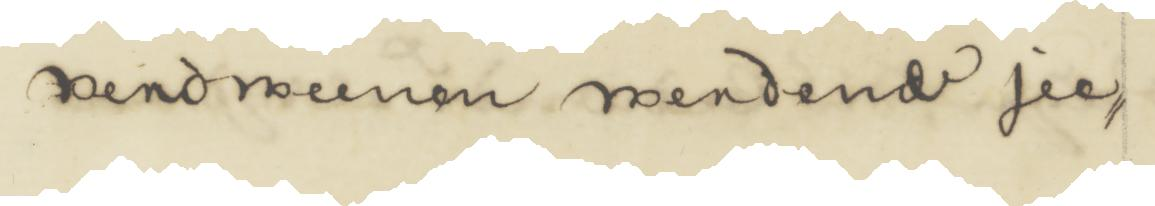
verdweenen werdende jee„
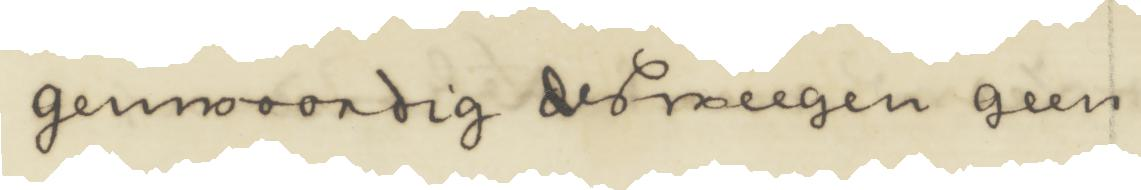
genwoordig desweegen geen
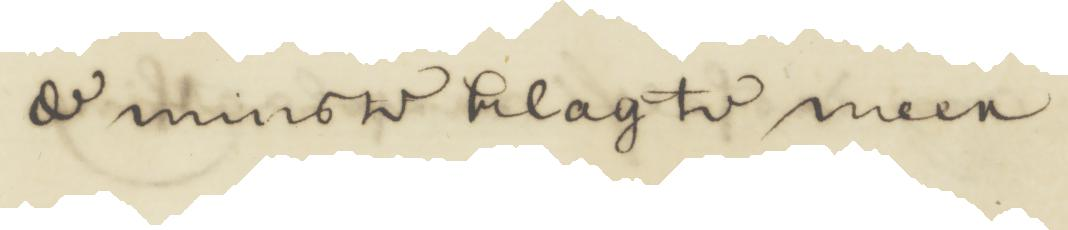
de minste klagte meer
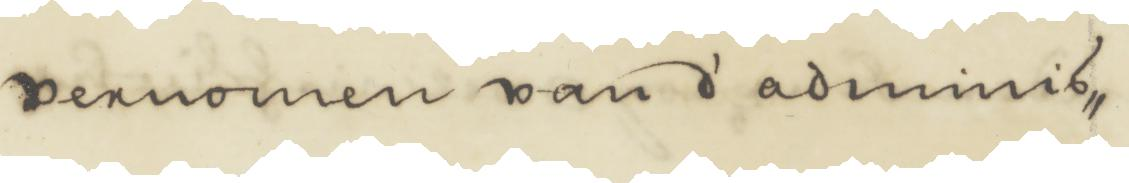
vernomen van d’ adminis„
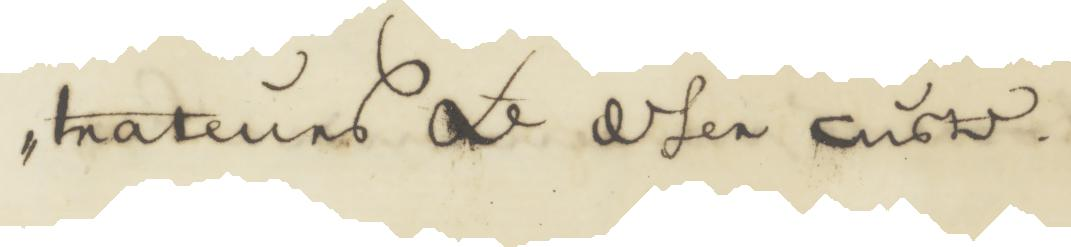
„trateurs te deser custe.
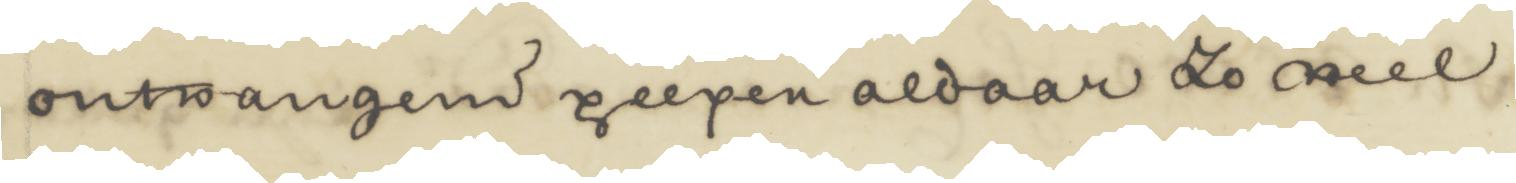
ontvangene peeper aldaar Zo veel
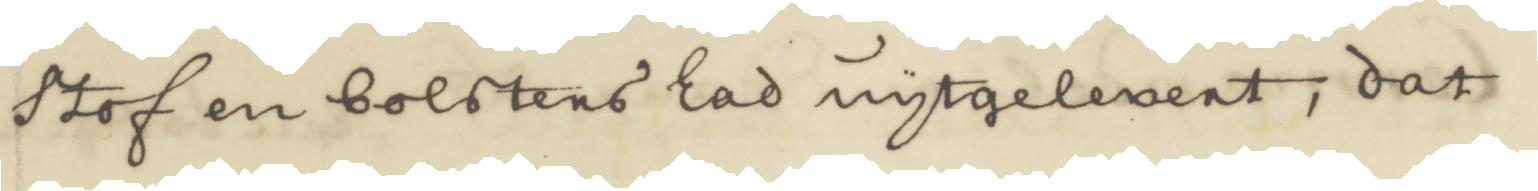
Stof en bolsters had uijtgelevert, dat
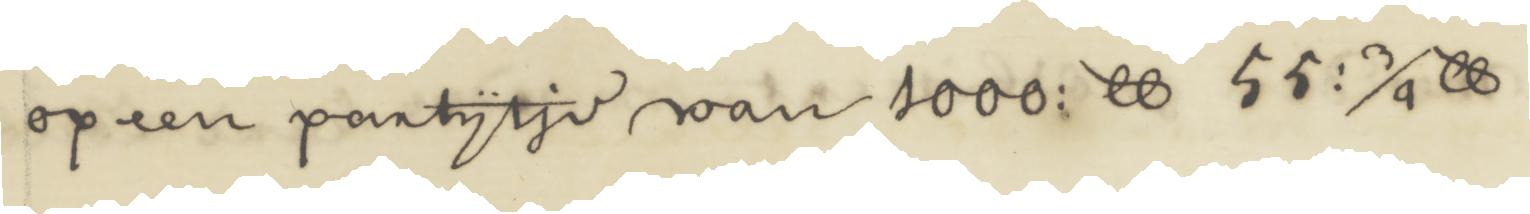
op een partijtje van 1000: lb 55:¾ lb
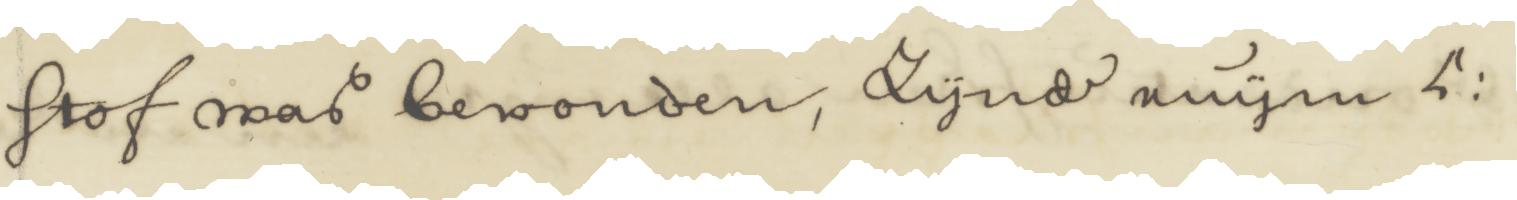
stof was bevonden, Zijnde ruijm 5:
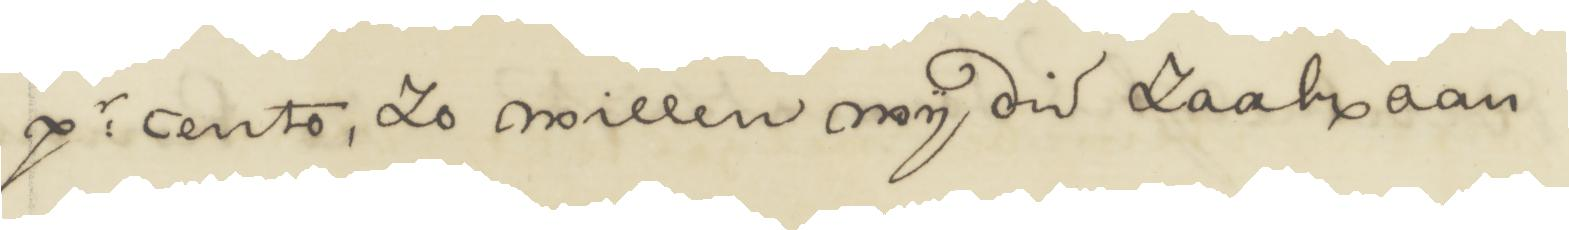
p:r cento, Zo willen wij die zaak aan
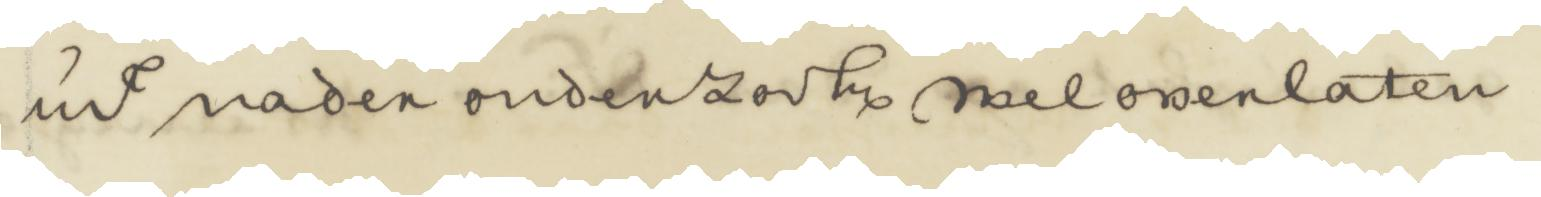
uE nader onderzoek wel overlaten
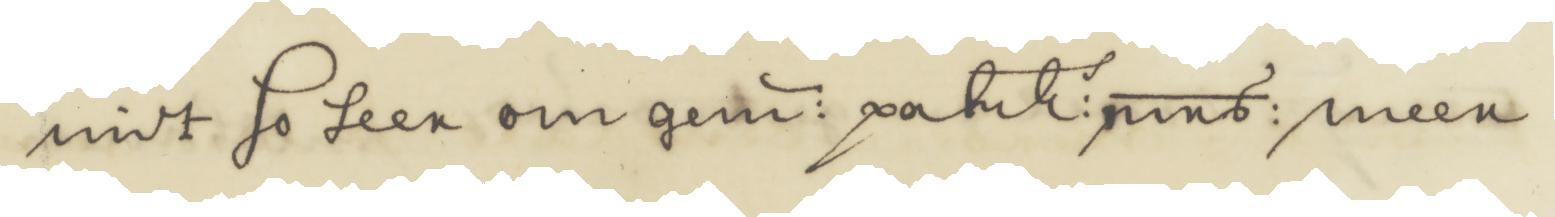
niet So seer om gem: pakh:s mrs: meer
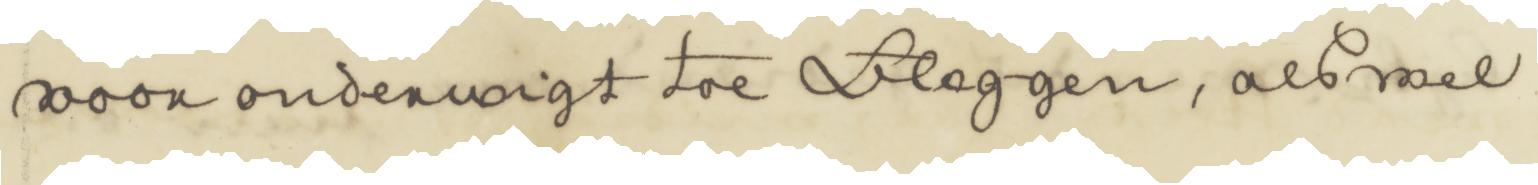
voor onderwigt toe teleggen, als wel
